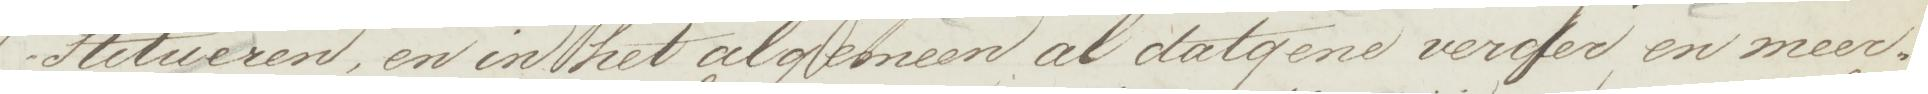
„stitueren, en in het algemeen al datgene verder en meer„
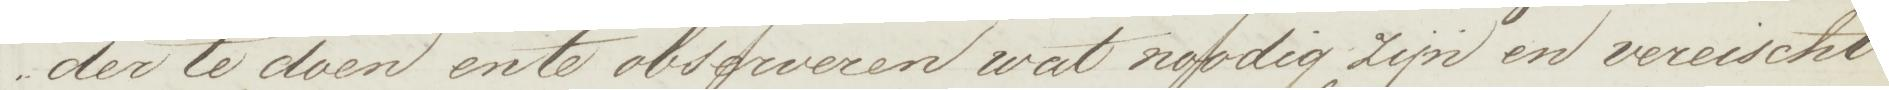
„der te doen en te observeren wat noodig zijn en vereischt
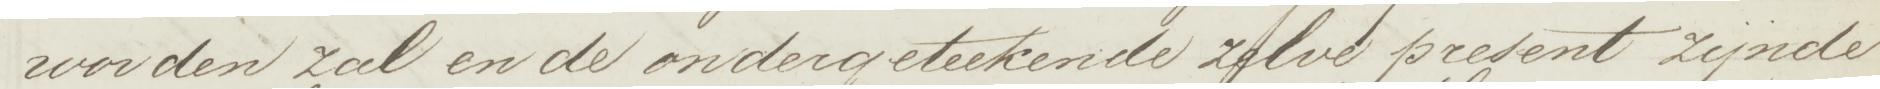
worden zal en de ondergeteekende zelve present zijnde
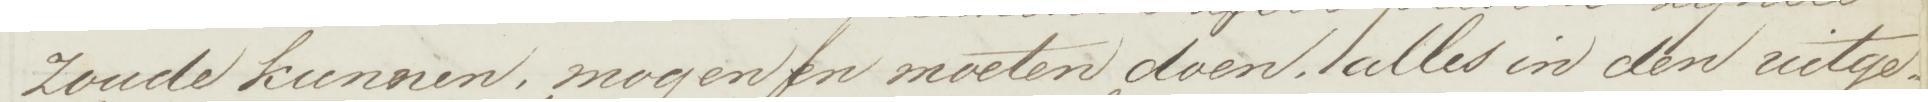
zoude kunnen, mogen en moeten doen, alles in den uitge„
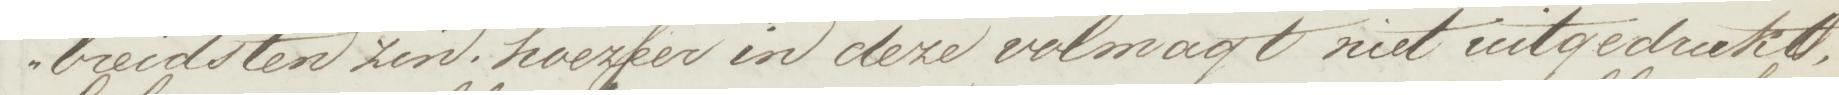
„breidsten zin, hoezeer in deze volmagt niet uitgedrukt,
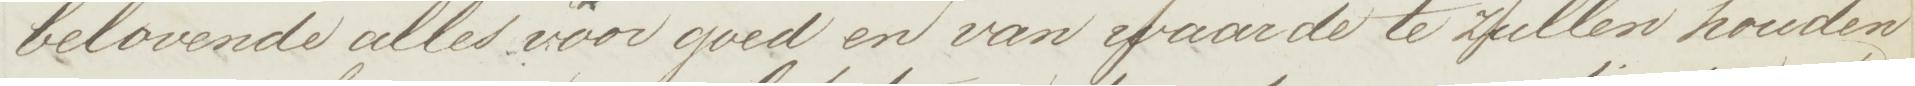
belovende alles voor goed en van waarde te zullen houden
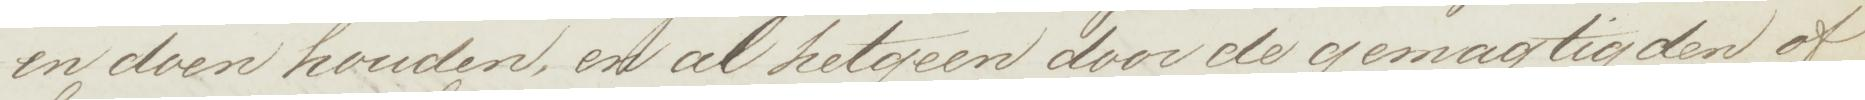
en doen houden, en al hetgeen door de gemagtigden of
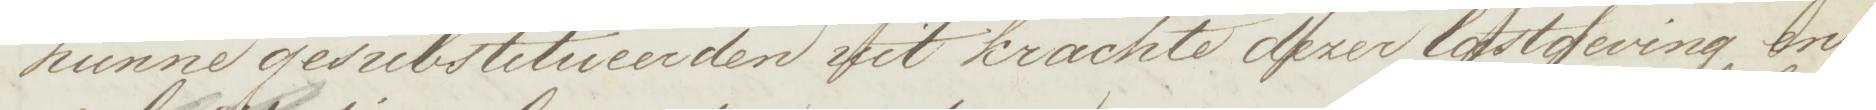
hunne gesubstitueerden uit krachte dezer lastgeving en
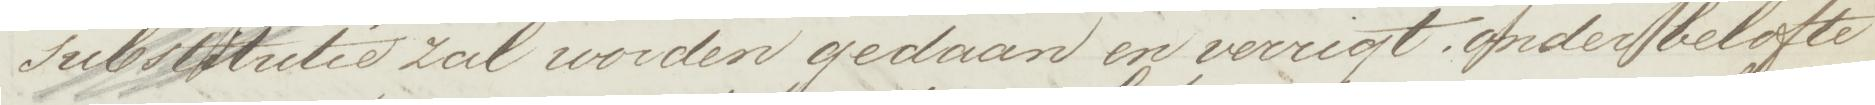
substitutie zal worden gedaan en verrigt, onder belofte
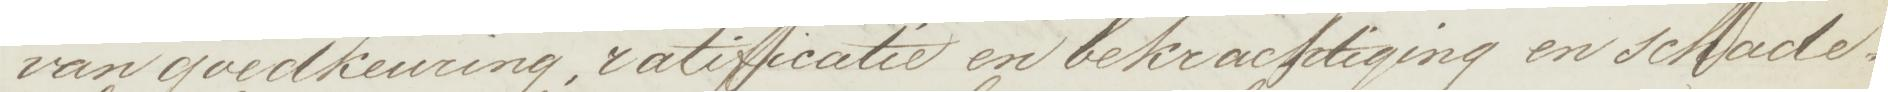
van goedkeuring, ratificatie en bekrachtiging en schade„
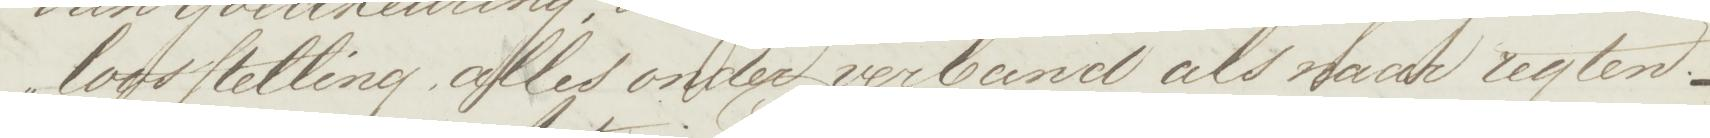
„loosstelling, alles onder verband als naar regten.
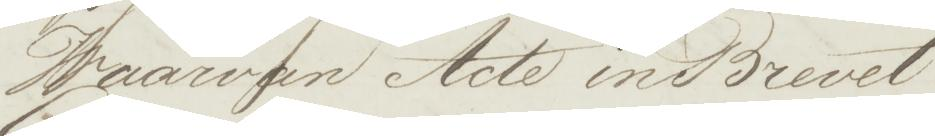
Waarvan Acte in Brevet
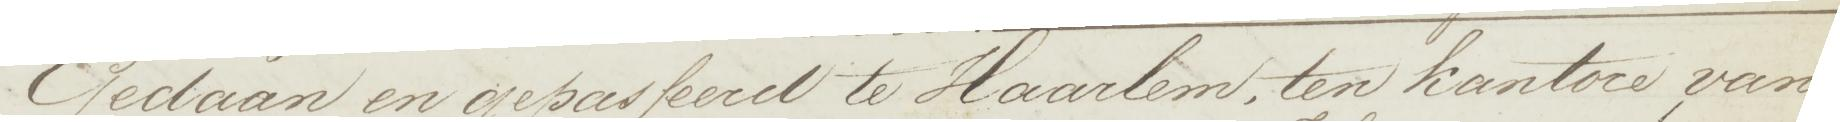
Gedaan en gepasseerd te Haarlem, ten kantore van
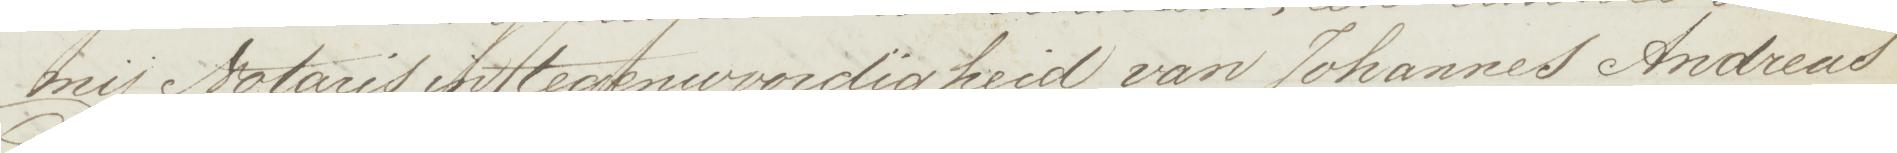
mij Notaris in tegenwoordigheid van Johannes Andreas
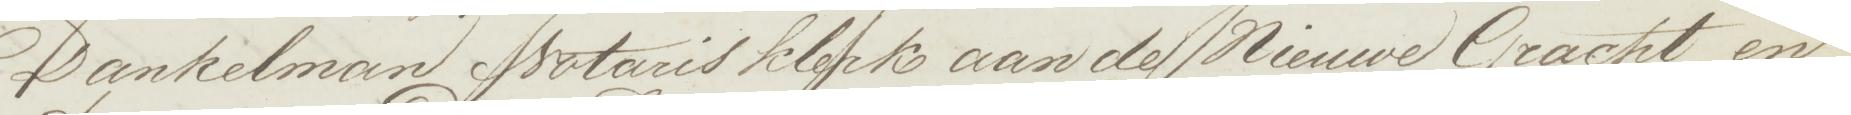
Dankelman Notaris klerk aan de Nieuwe Gracht en
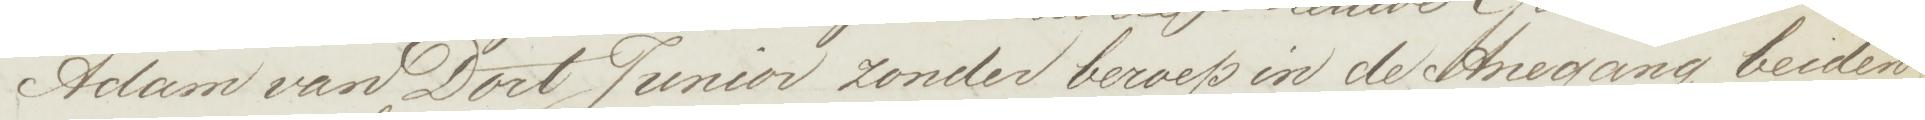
Adam van Dort Junior zonder beroep in de Anegang, beiden
